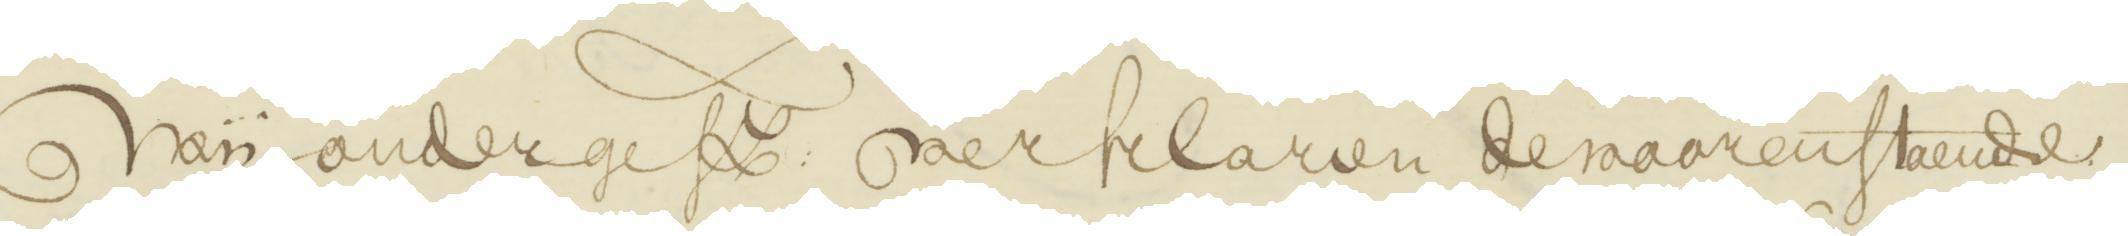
Wij ondergesz: verklaren de voorenstaende
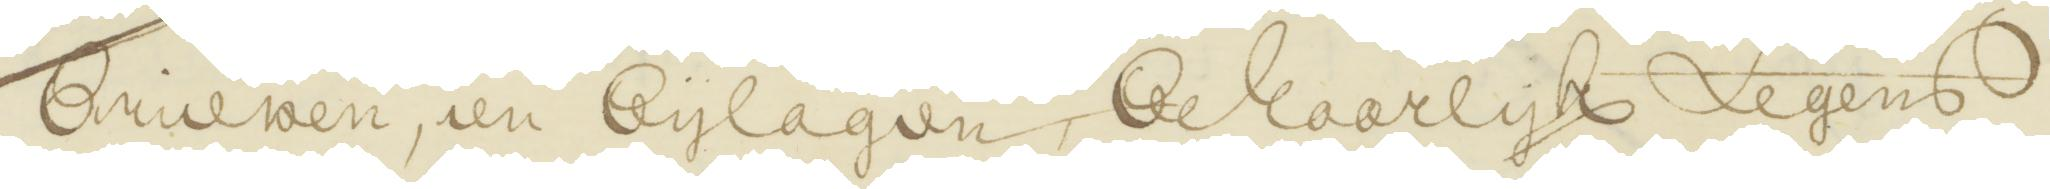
brieven, en bijlagen, behoorlijk tegens
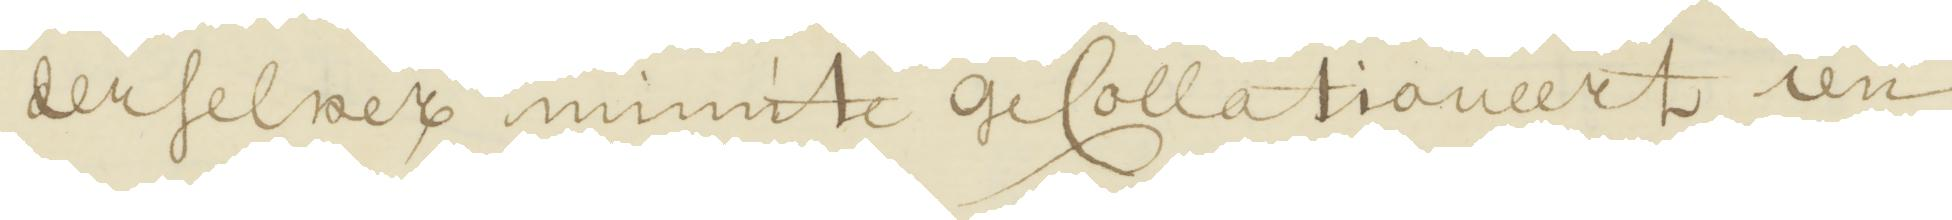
derselver minute gecollationeert en
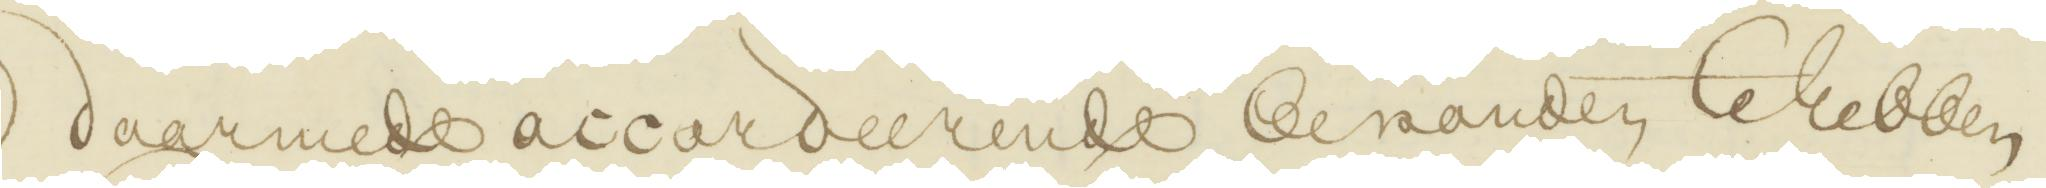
daarmede accordeerende bevonden te hebben
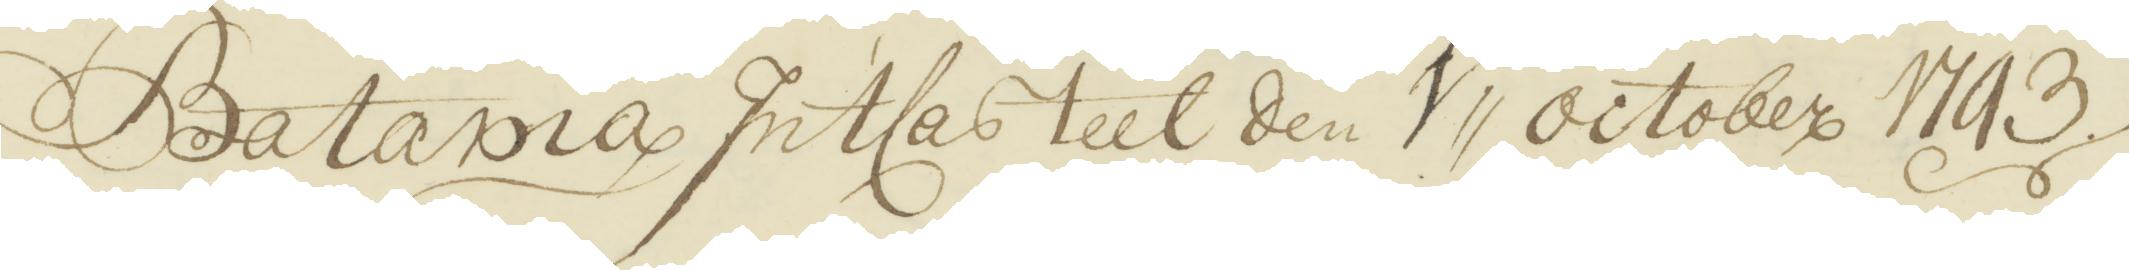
Batavia In’t Casteel den 1„sten october 1743.
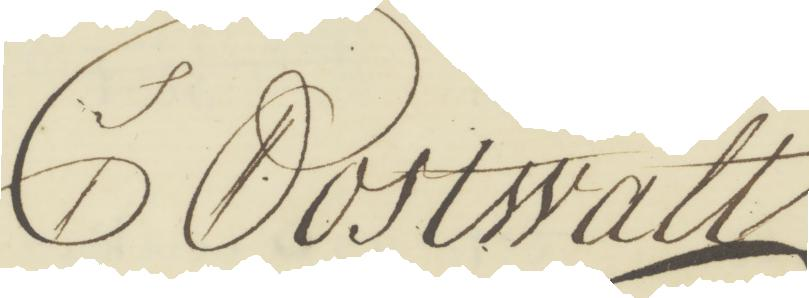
C„s Oostwalt
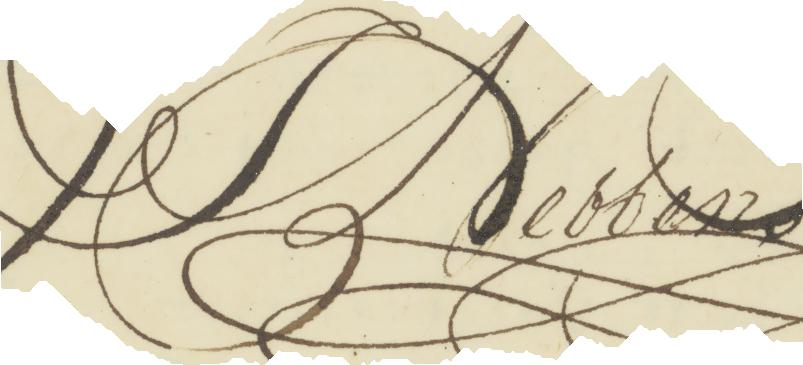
JS debbens
